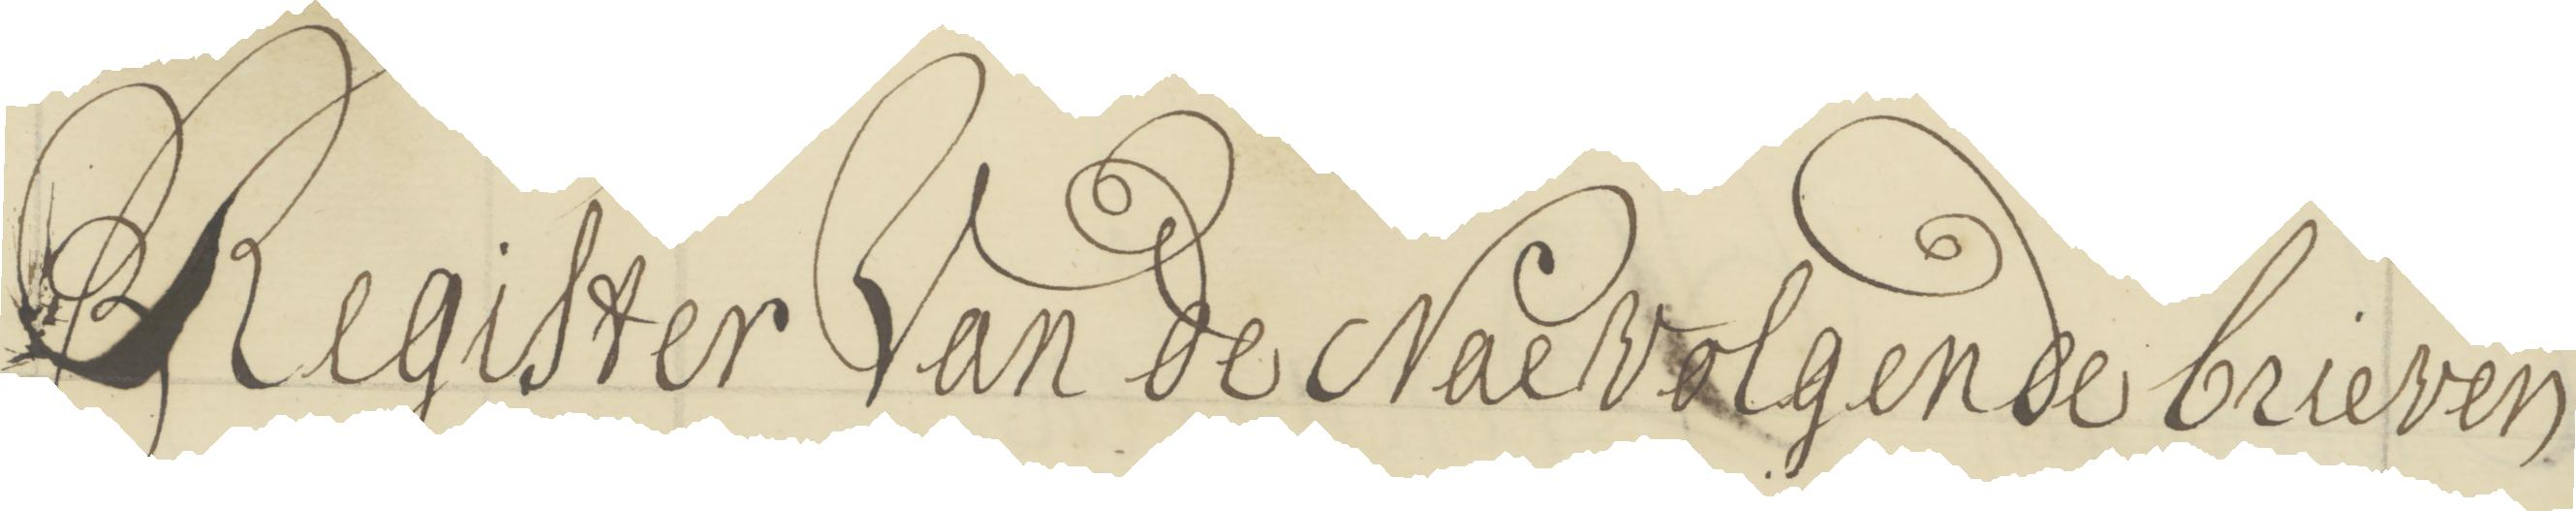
Register Van de Naevolgende brieven
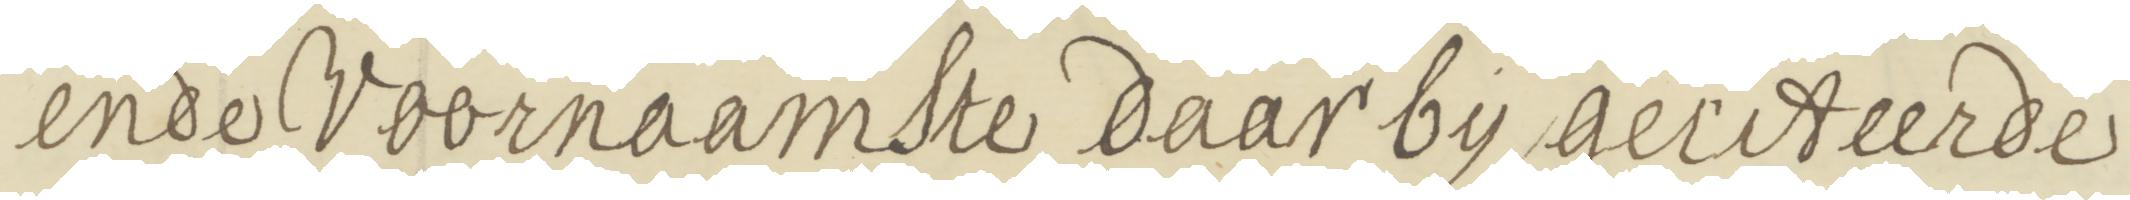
ende Voornaamste daar bij geciteerde
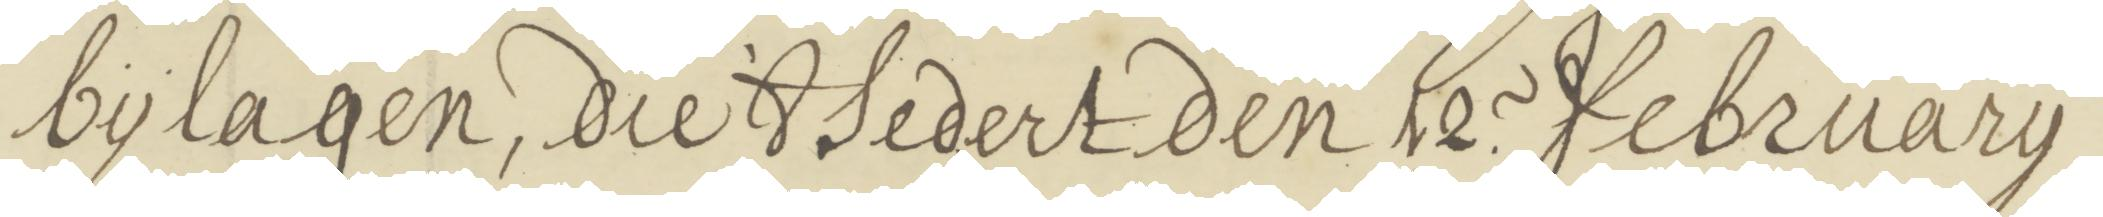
bijlagen, die 't sedert den 12:' februarij
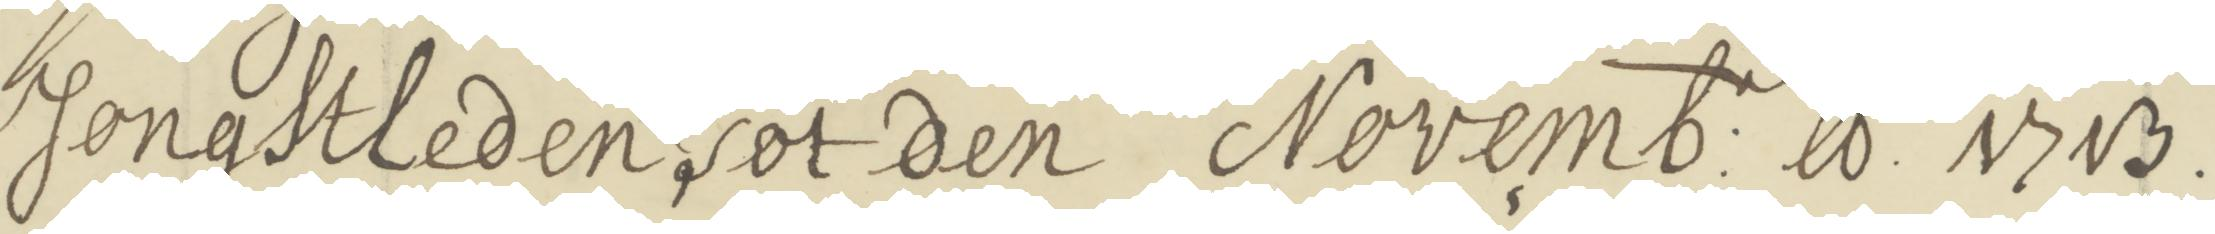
Jongstleden Tot den Novemb:r A.o 1713
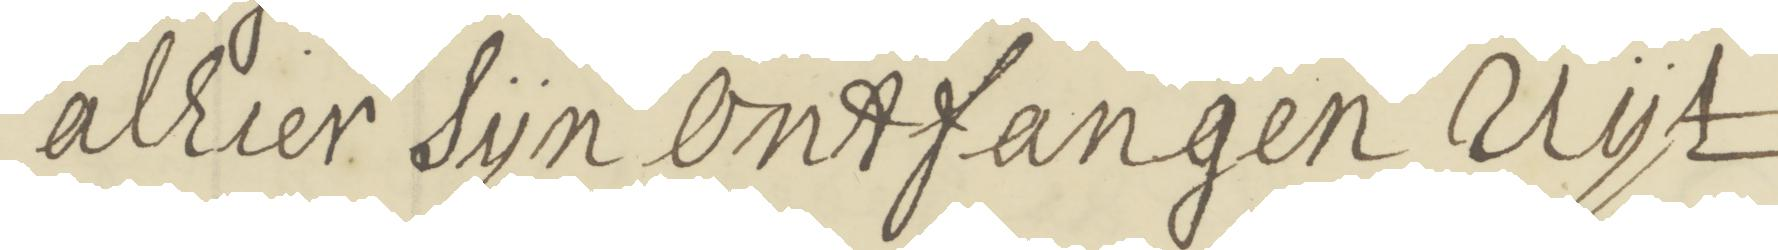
alhier sijn ontfangen Uijt
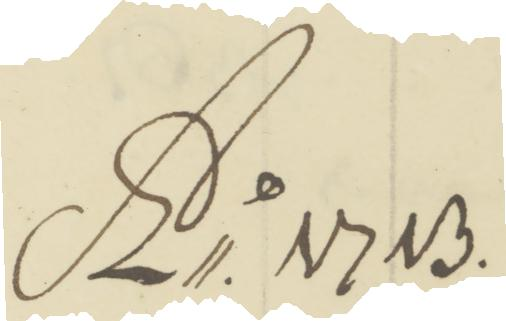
A„o 1713.
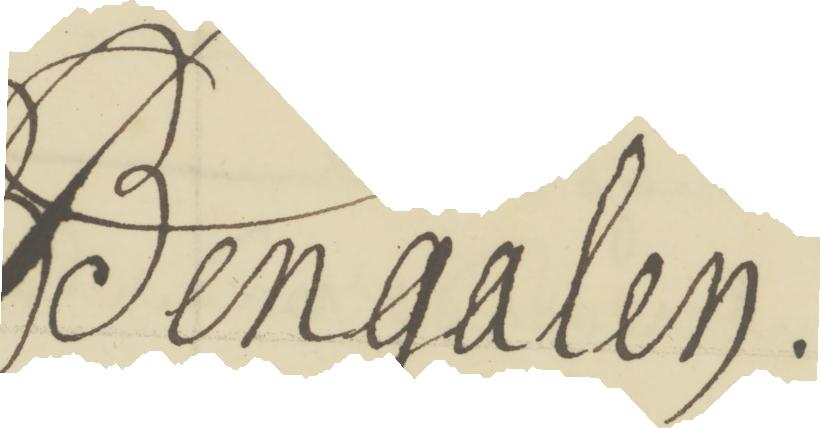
Bengalen
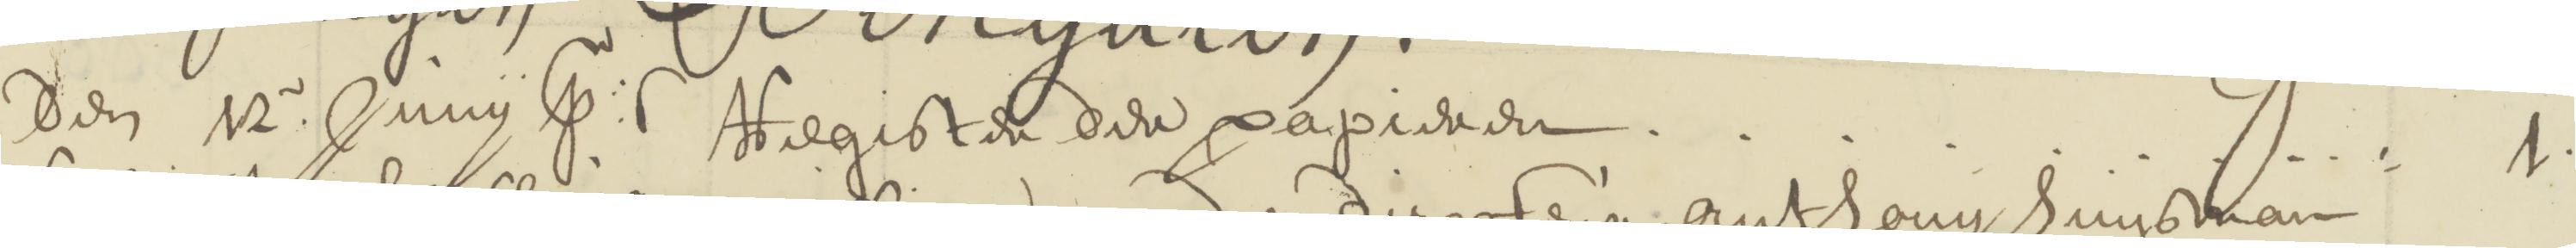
den 12.' Junij p:rs Register der papieren - - - - - - - - - „ 1
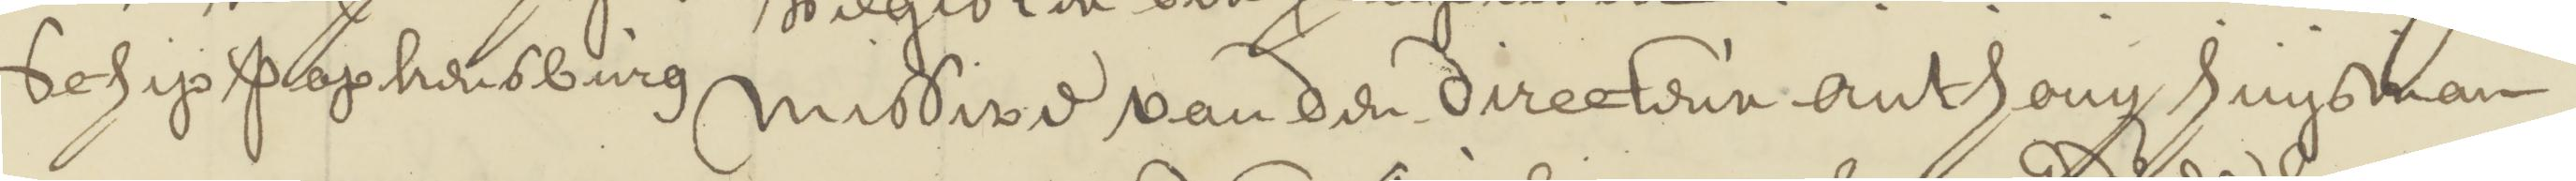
schip Papkensburg missive van den directeur anthonij huijsman
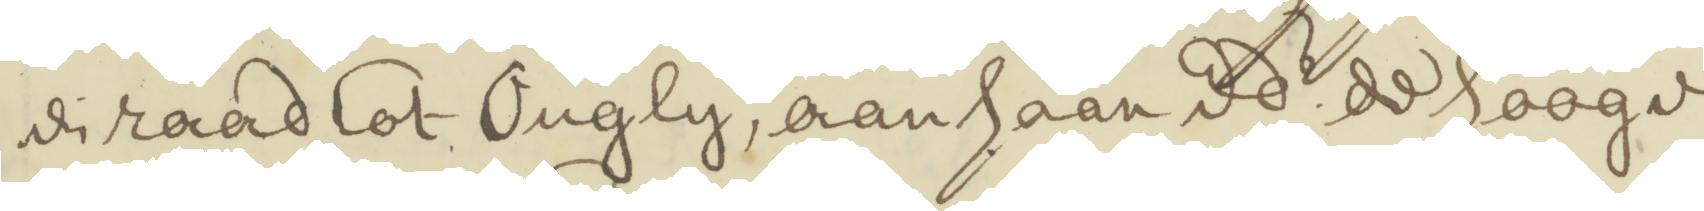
en raad tot Ouglij, aan haar Ed:' de hooge
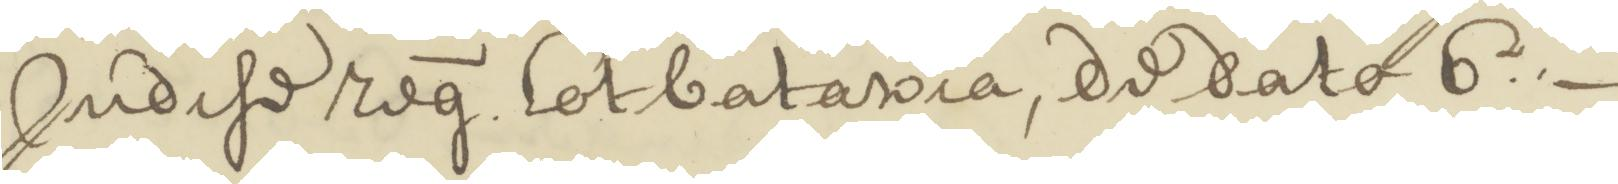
Jndise reg. tot batavia, de dato 6 - - —
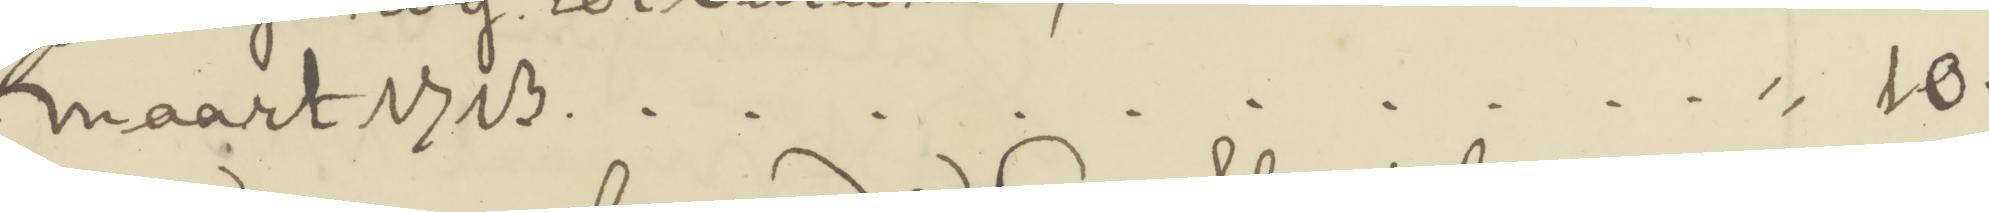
maart 1713 - - - - - - - - - - - „ 10
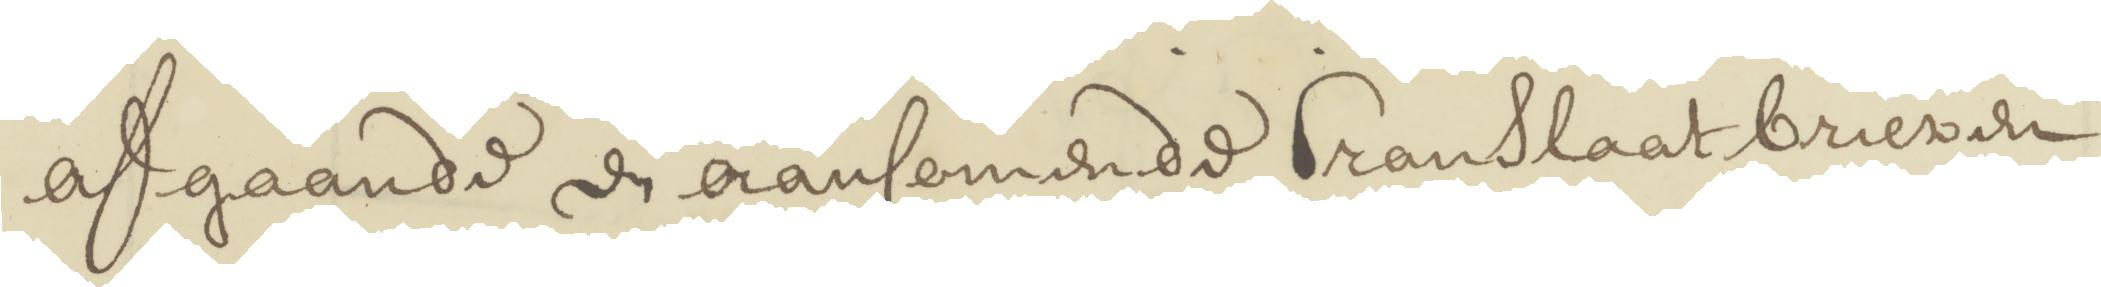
afgaande en aancomende translaat brieven
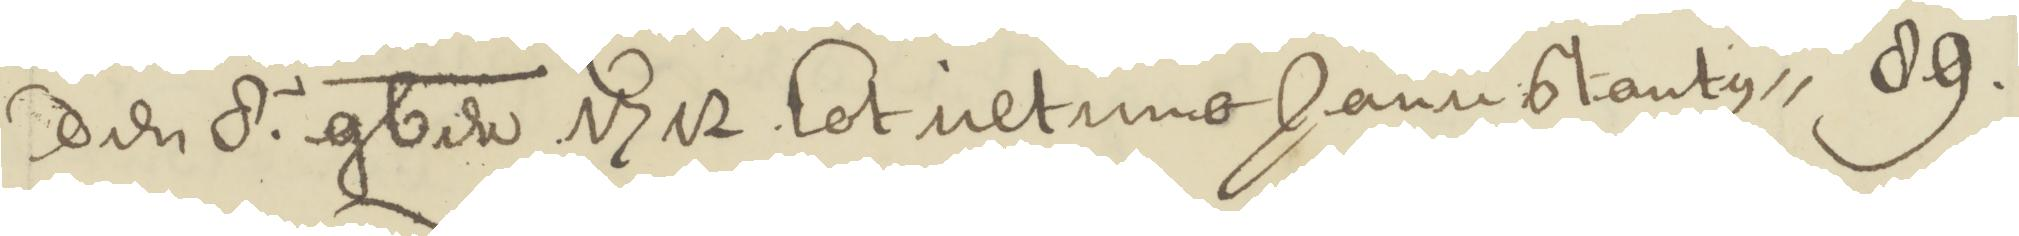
den 8.' 9ber 1712 tot ultimo Janu stantij „ 89.
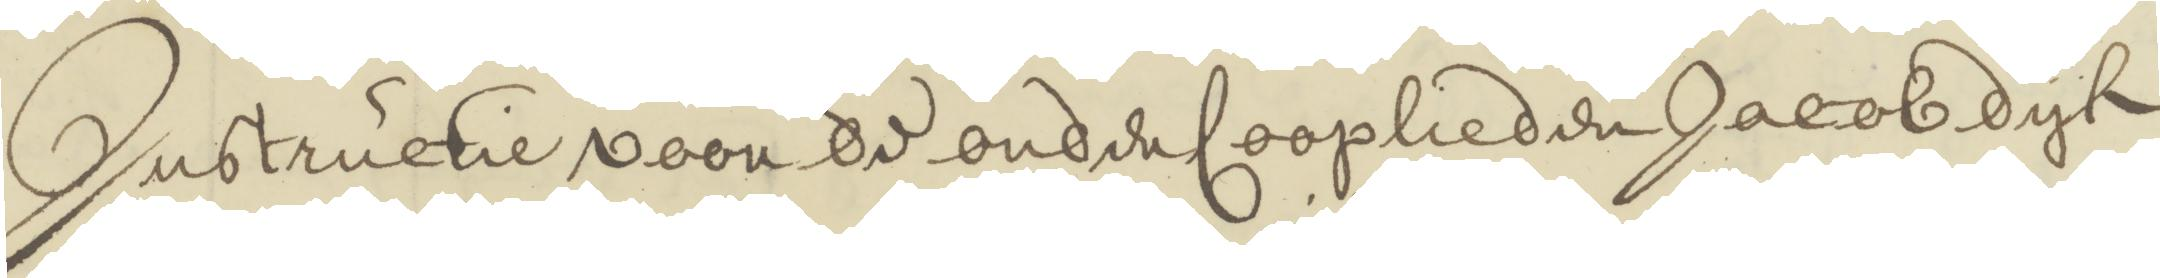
Jnstructie voor de onder Cooplieden Jacob dijk
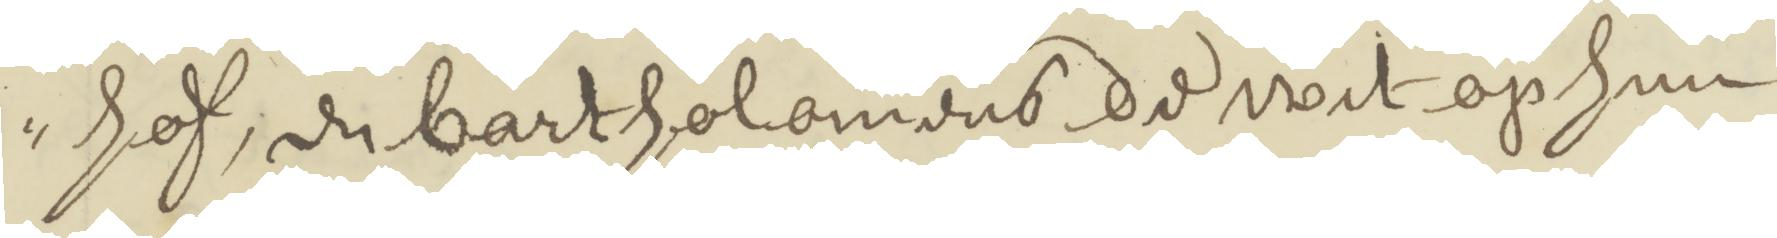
„hof, en bartholomeus de wit op hun
